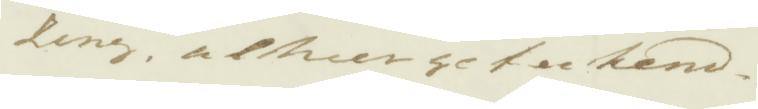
zing, alhier geteekend
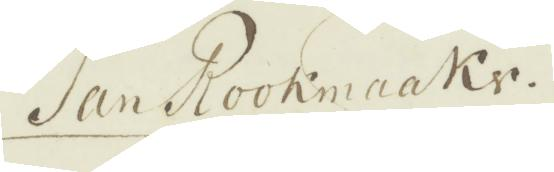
Ian Rookmaakr.
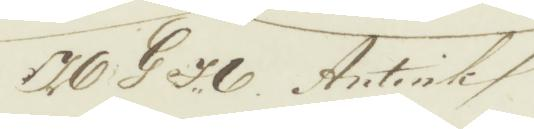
H. G. H. Antink
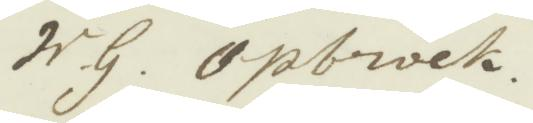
W. G. Opbroek.
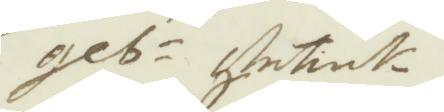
geb= Antink
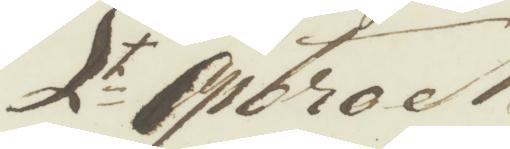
L=t Opbroek
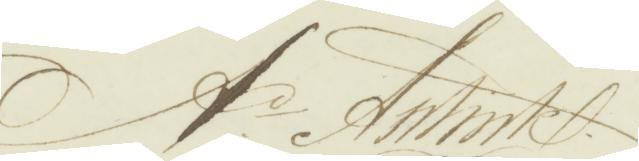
A-d Antink.
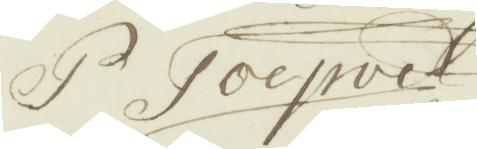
P Toepoel
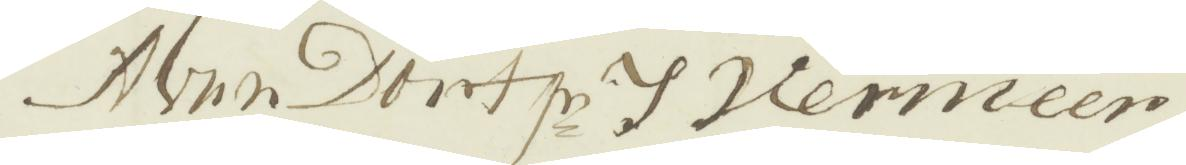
A van Dort j=r I Vermeer
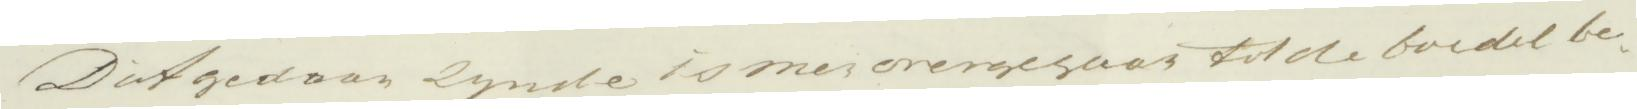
Dat gedaan zynde is men overgegaan tot de boedel be„
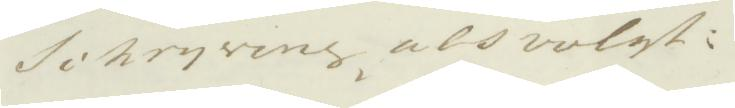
schryving als volgt:
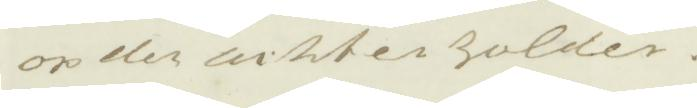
op den achter zolder.
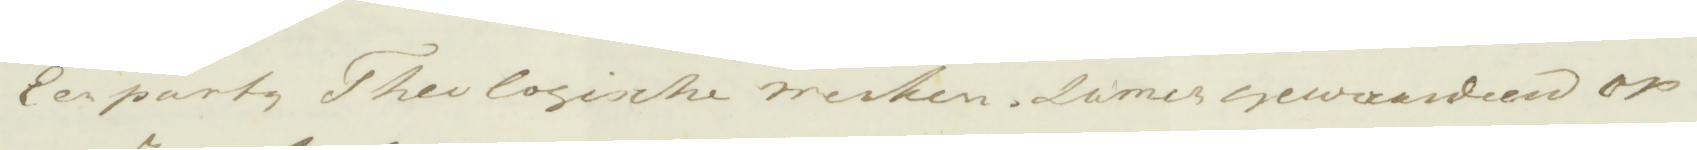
Een partij Theologische werken, zamen gewaardeerd op
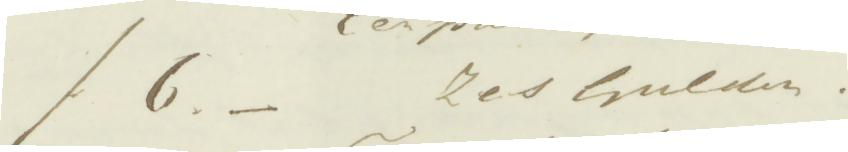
ƒ 6. — Zes Gulden.
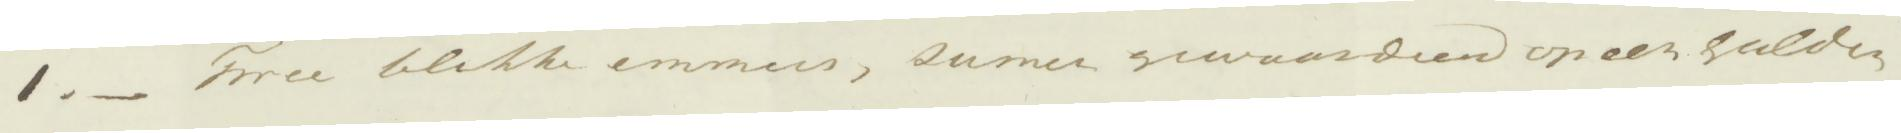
1. — Twee blikke emmers, zamen gewaardeerd op een gulden
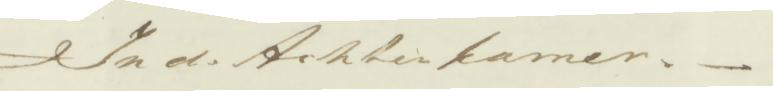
In de Achterkamer. —
